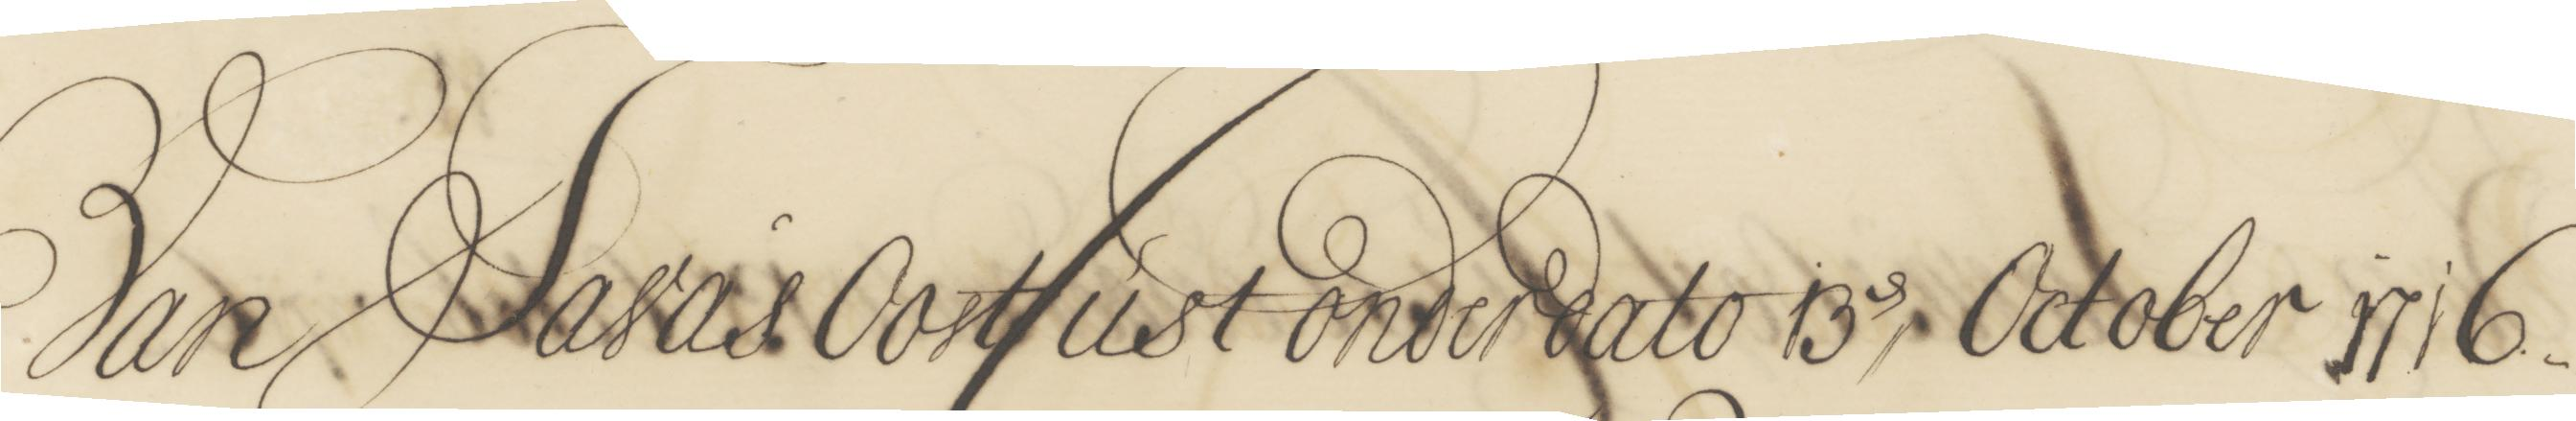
Van Java's Oost Cust onder dato 13„en October 1716. —
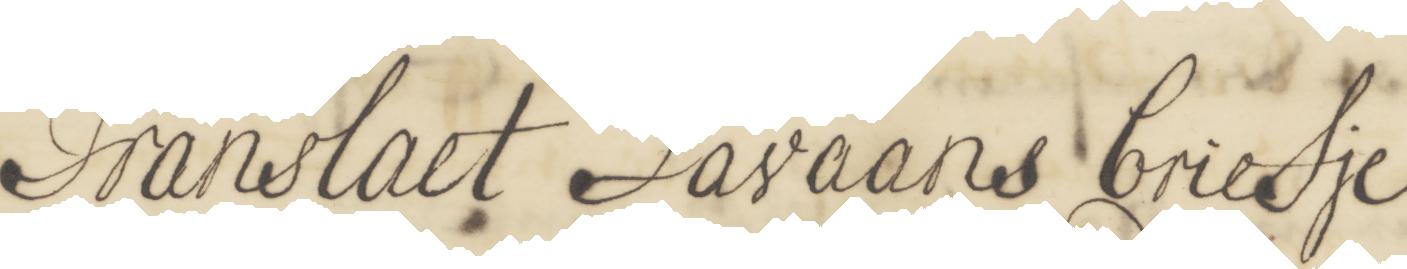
Translaet Javaans briefje
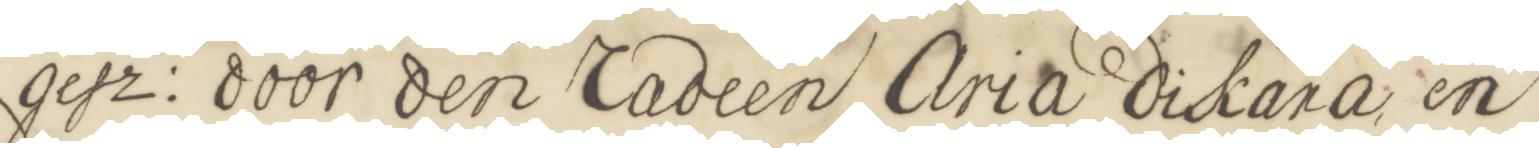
gesz: door den radeen Aria dikara, en
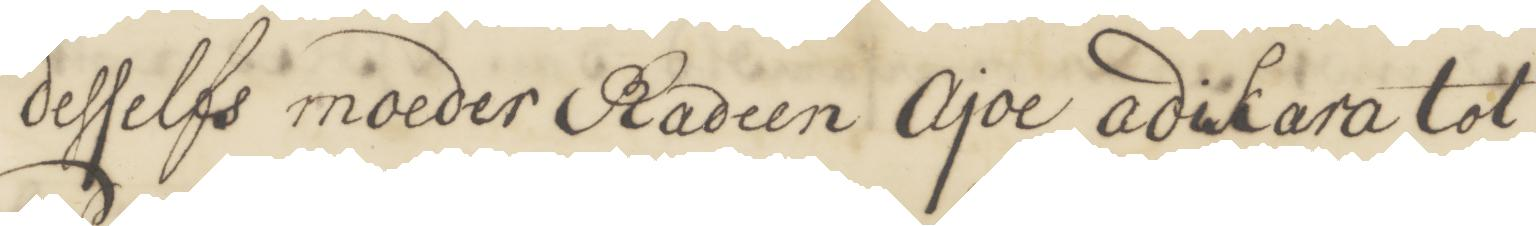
desselfs moeder Radeen Ajoe adikara tot
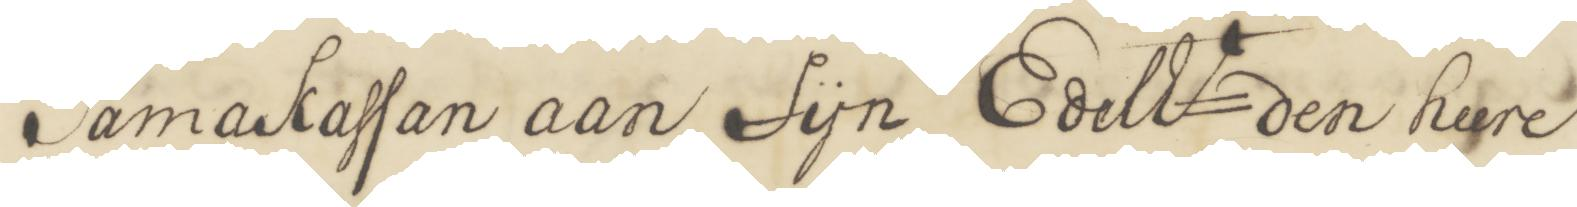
Pamakassan aan sijn Edelh=t den heere
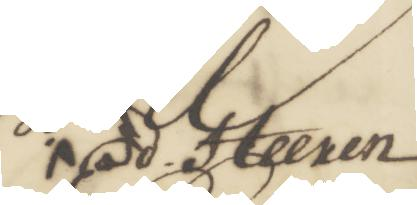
^ Ed: Heeren
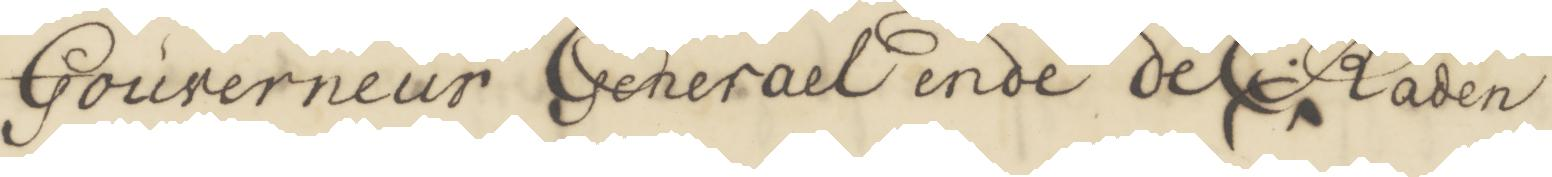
Gouverneur Generael ende de Raden
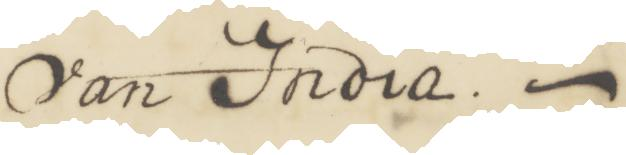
van Jndia. —
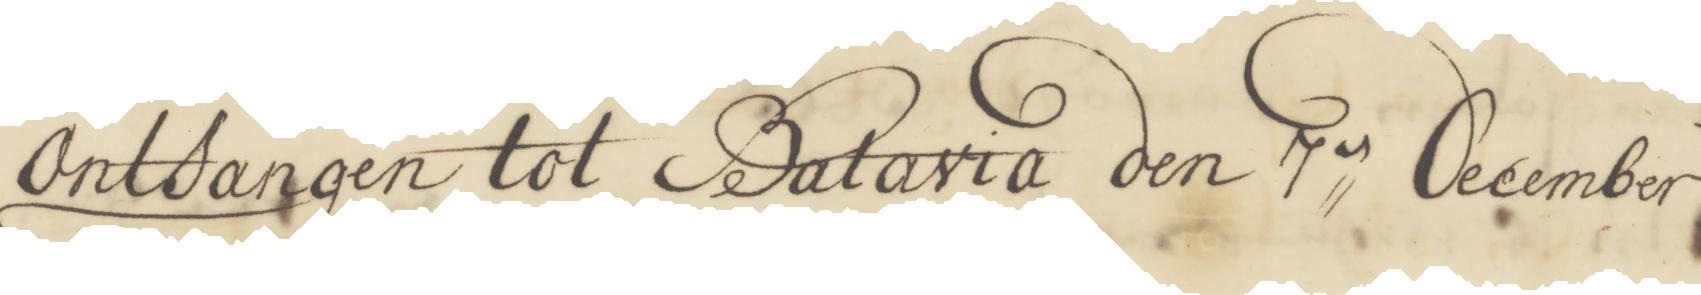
Ontfangen tot Batavia den 7„en December
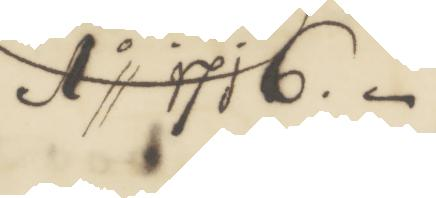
A„o 1716. —
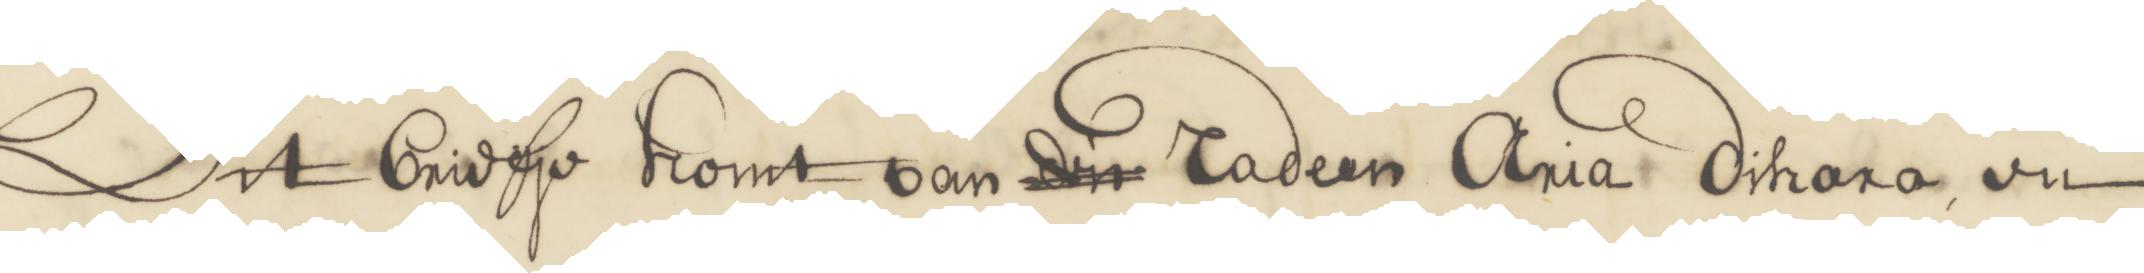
Dit briefje komt van den radeen Aria dikara, en
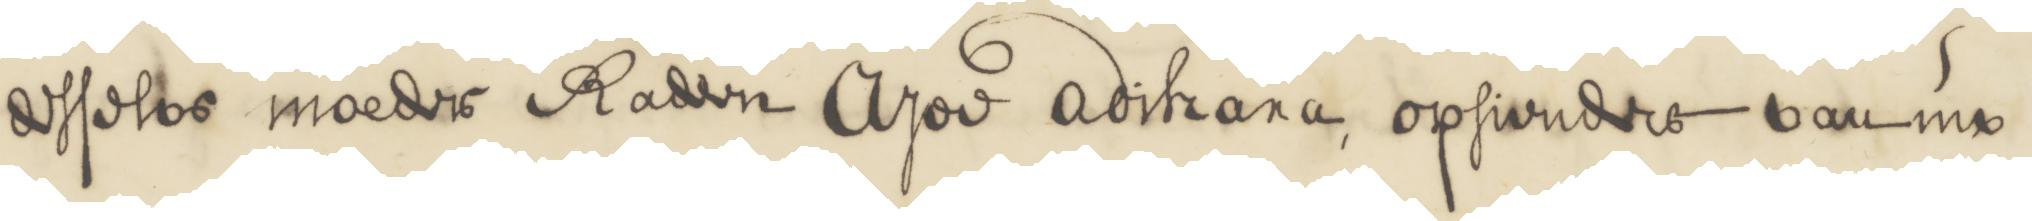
desselvs moeder Radeen Ajoe adikara, opsienders van uw
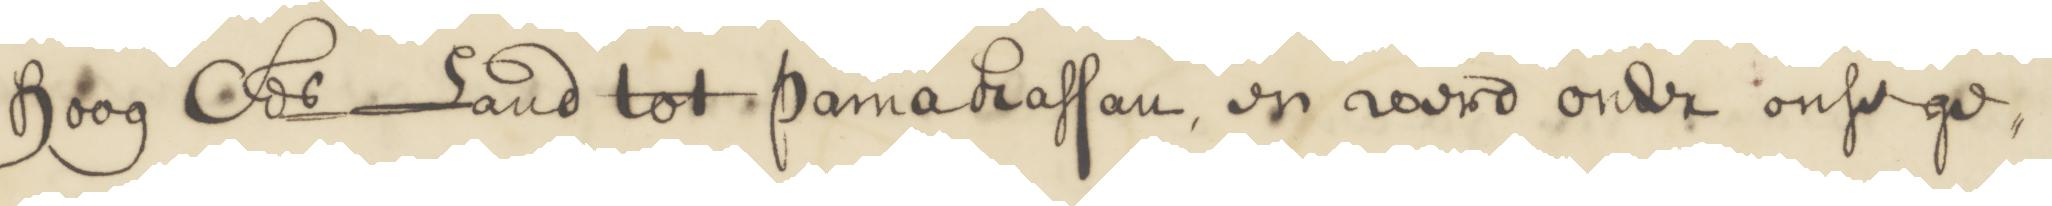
hoog Ed=s Land tot pamakassan, en werd onder onse ge„
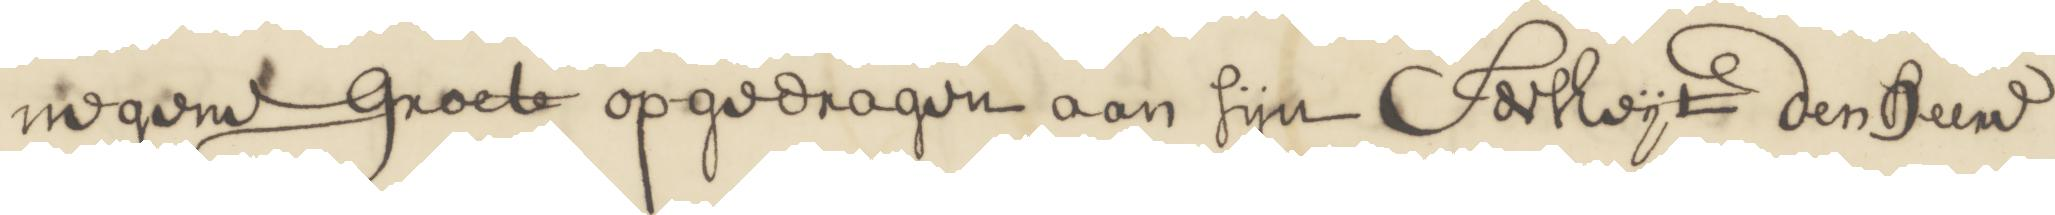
negene groete opgedragen aan sijn Edelheijt den heere
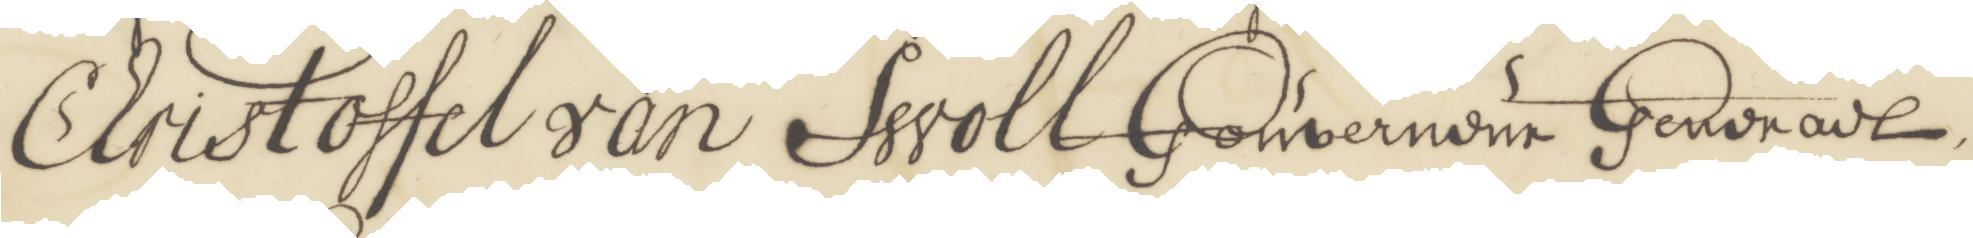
Christoffel van Swoll Gouverneur Generael
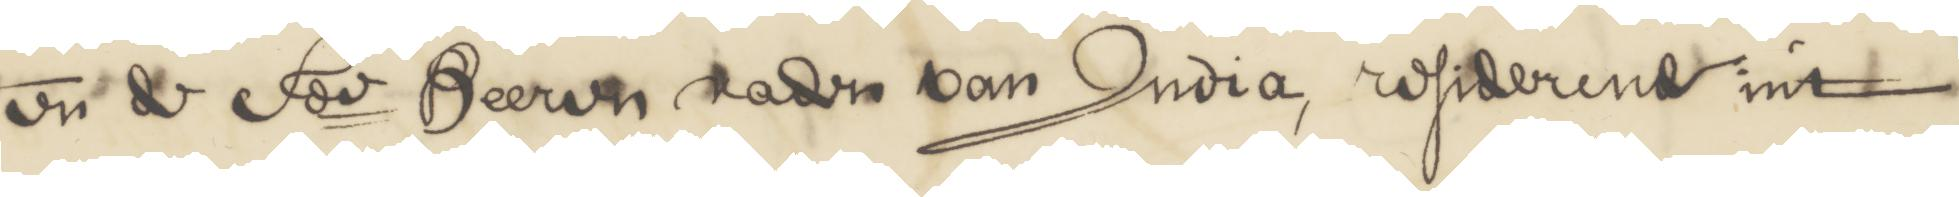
en de Ed=e heeren raden van Jndia, residerende in’t
